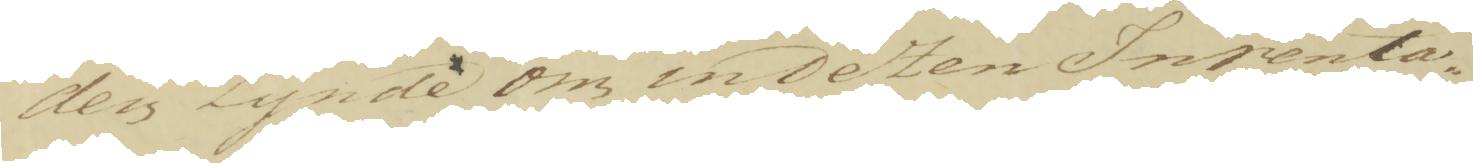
den zynde om in dezen Inventa„
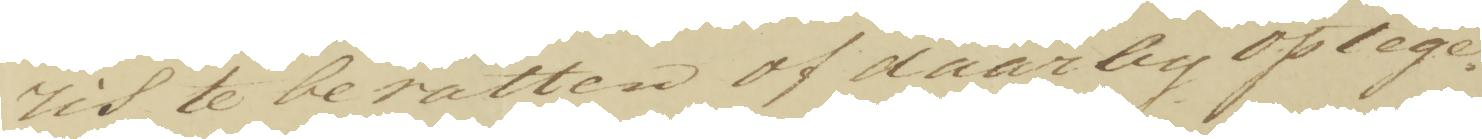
ris te bevatten of daarby op tege„
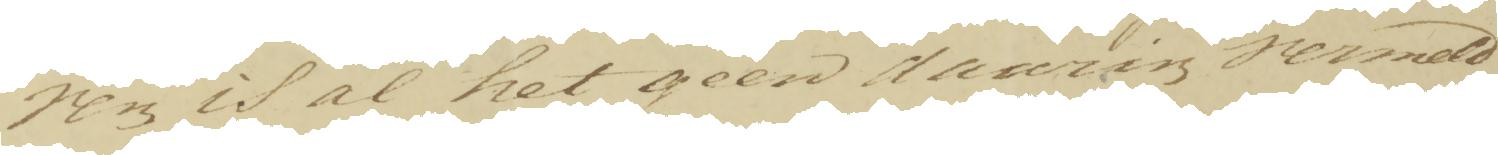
ven is al het geen daarin vermeld
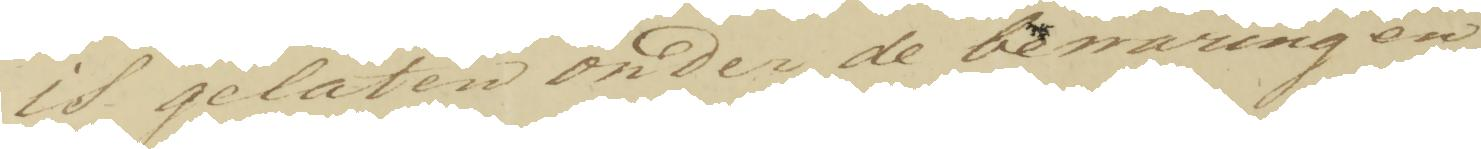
is gelaten onder de bewaring en
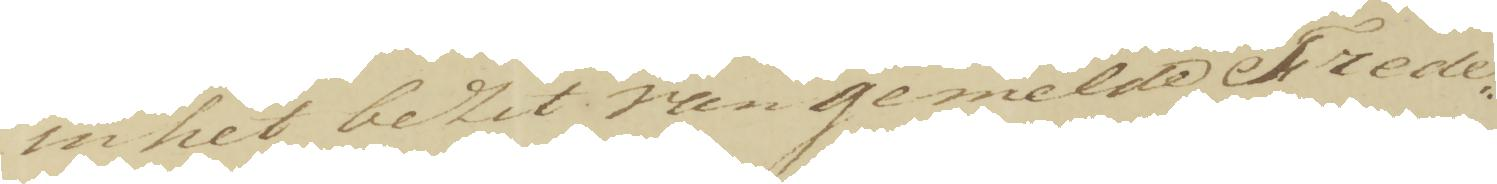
in het bezit van gemelde Frede„
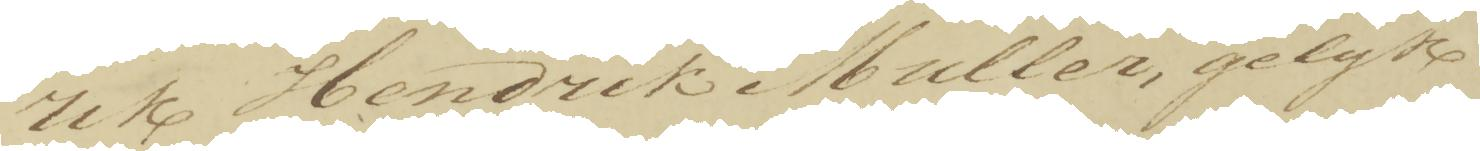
rik Hendrik Muller, gelyk
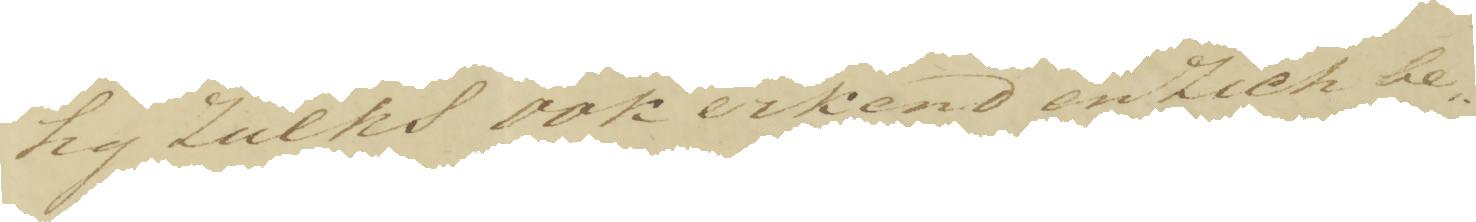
hy zulks ook erkend en zich be„
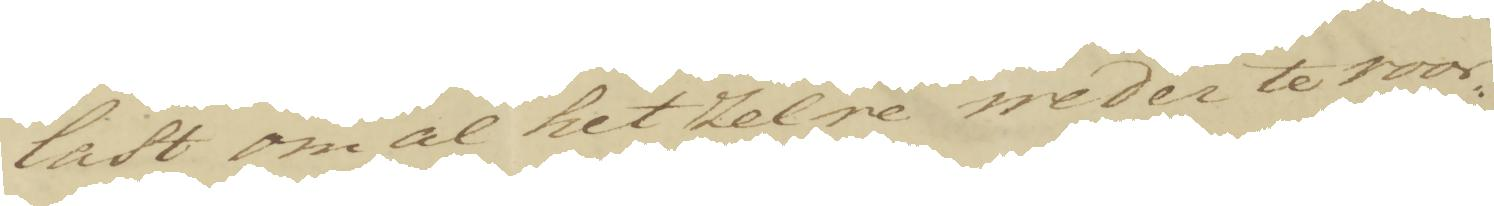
last om al het zelve weder te voor„
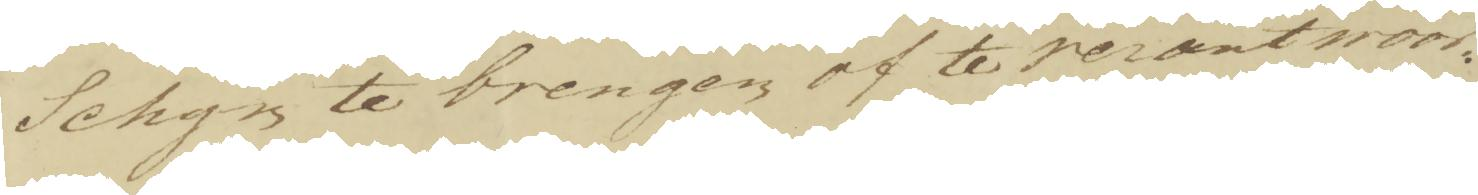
schyn te brengen of te verantwoor„
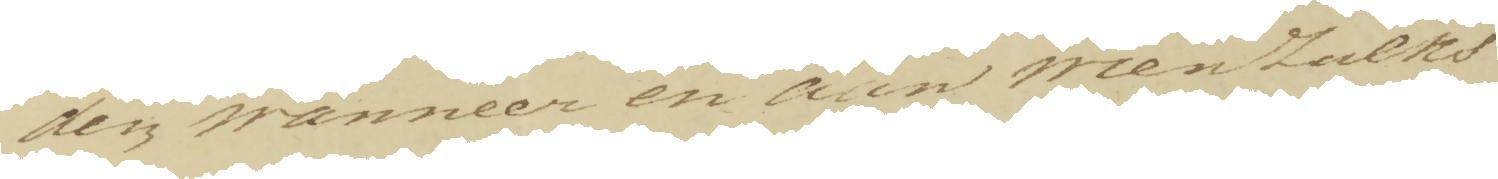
den wanneer en aan wien zulks
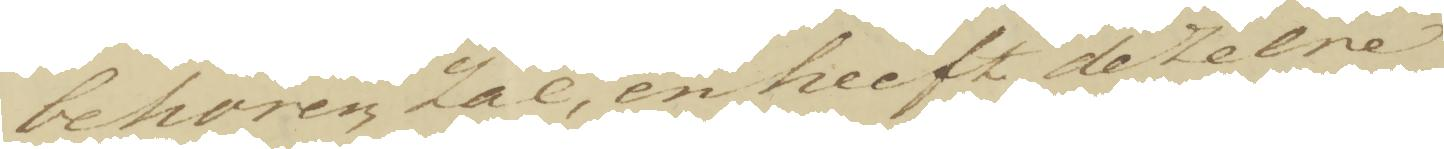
behoren zal, en heeft dezelve
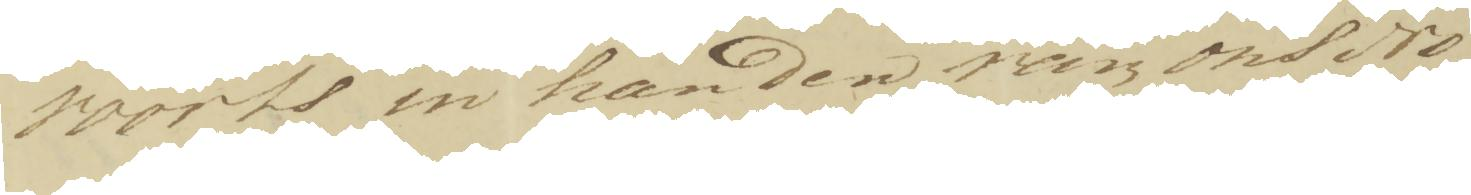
voorts in handen van ons No
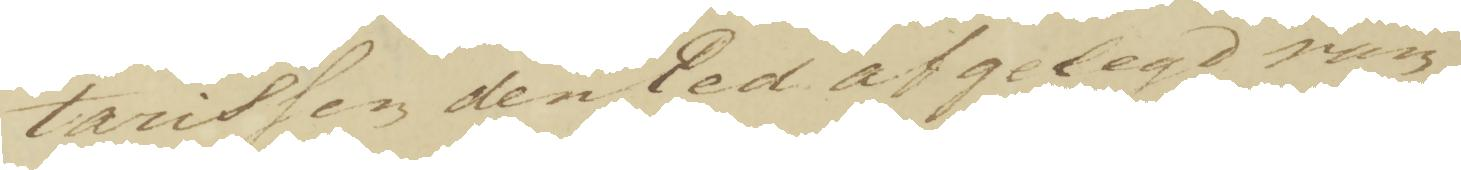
tarissen den Eed afgelegd van
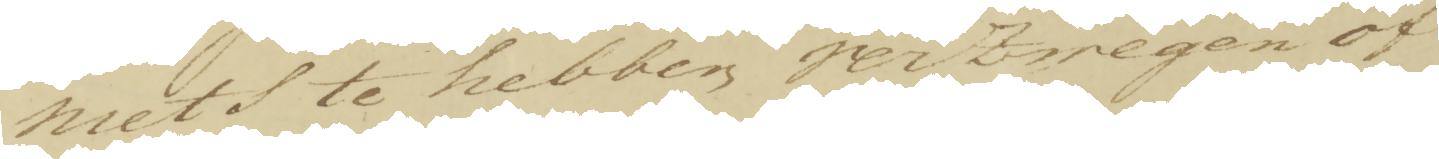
niets te hebben verzwegen of
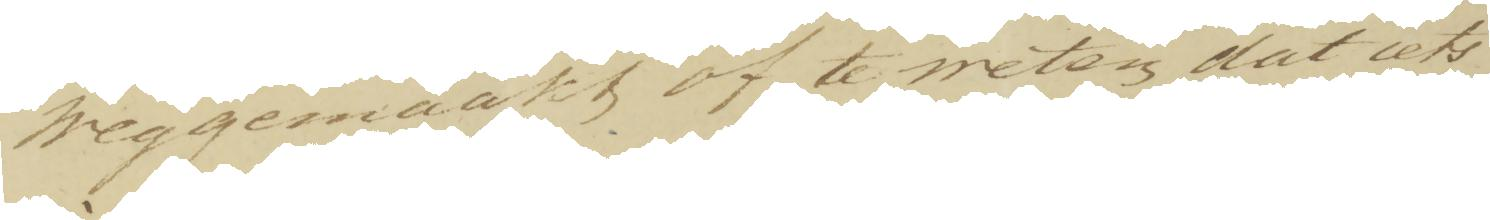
weggemaakt of te weten dat iets
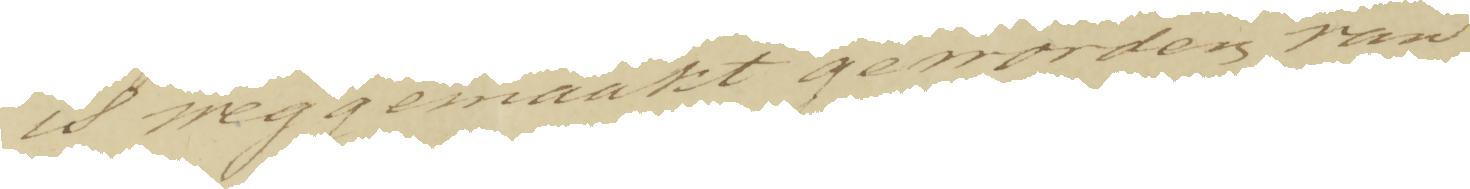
is weggemaakt geworden van
